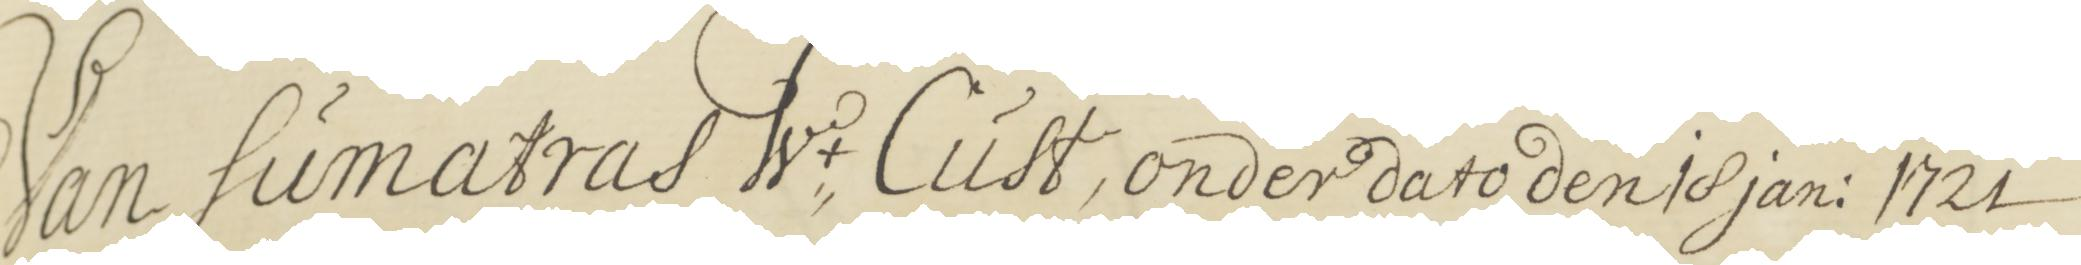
Van Sumatras W„t Cust, onder dato den 18 jan: 1721.
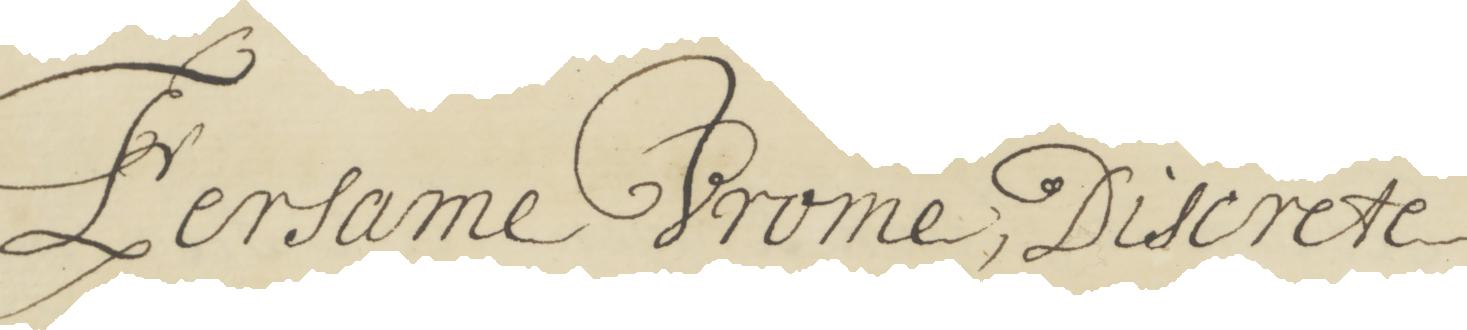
Eersame Vrome, Discrete
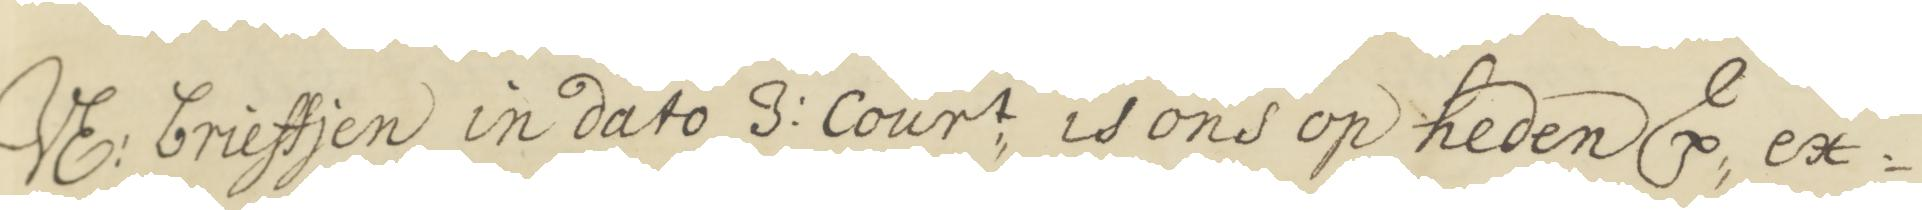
UE: brieffjen in dato 3: Cour„t is ons op heden p„l ex=
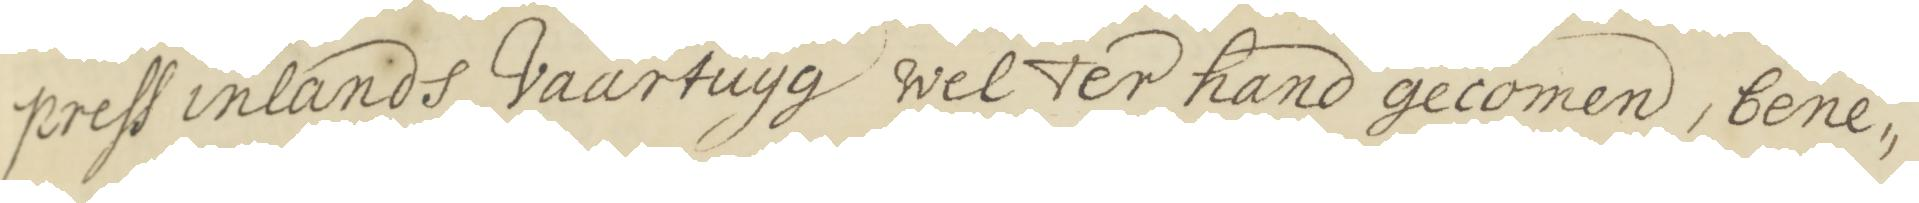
press inlands vaartuijg wel ter hand gecomen, bene„
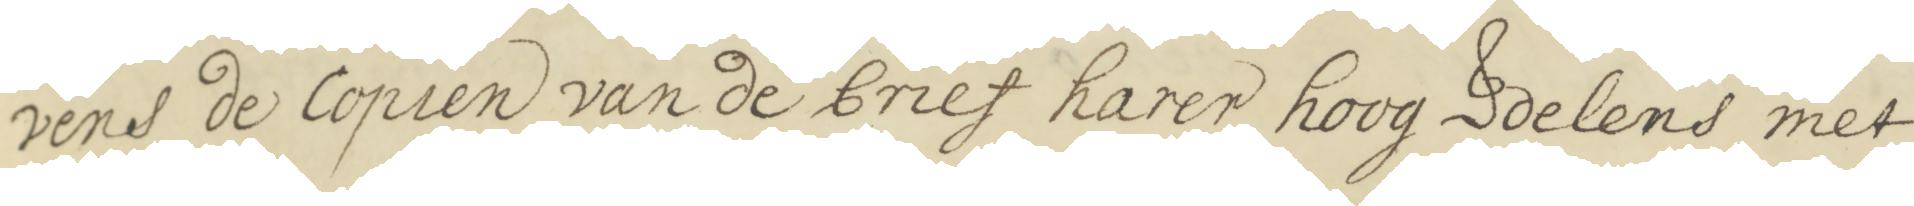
vens de copien van de brief harer hoog Edelens met
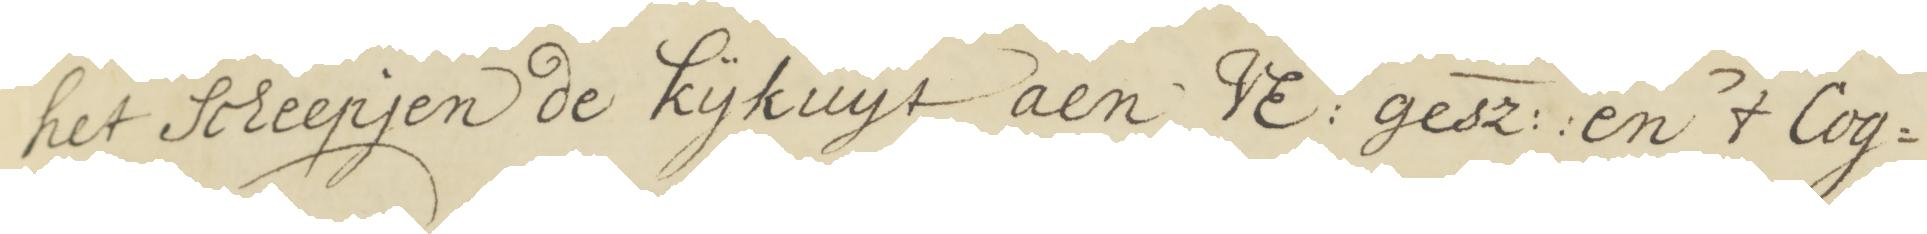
het scheepjen de kijkuijt aen UE: gesz: en ’t Cog=
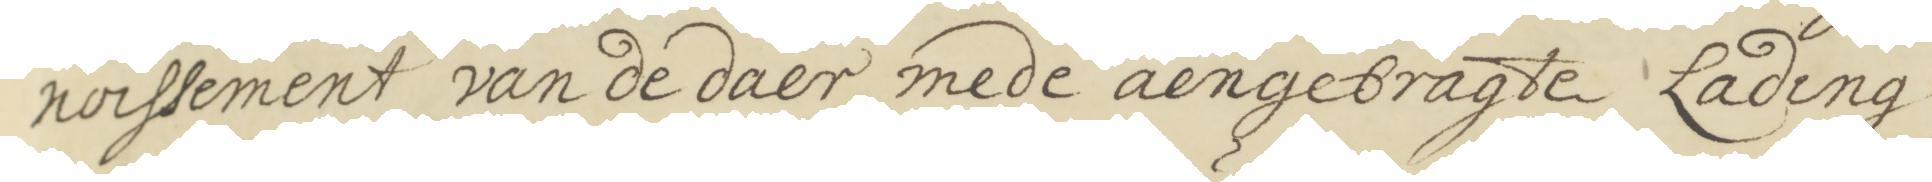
noissement van de daer mede-aengebragte Lading
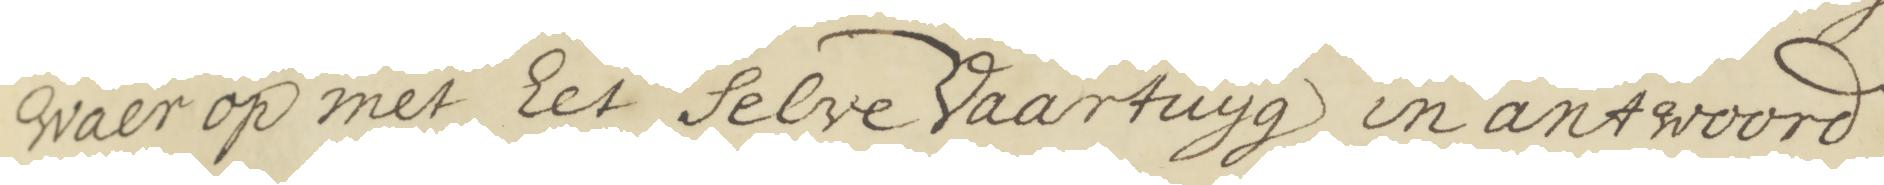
waer op met het selve vaartuijg in antwoord
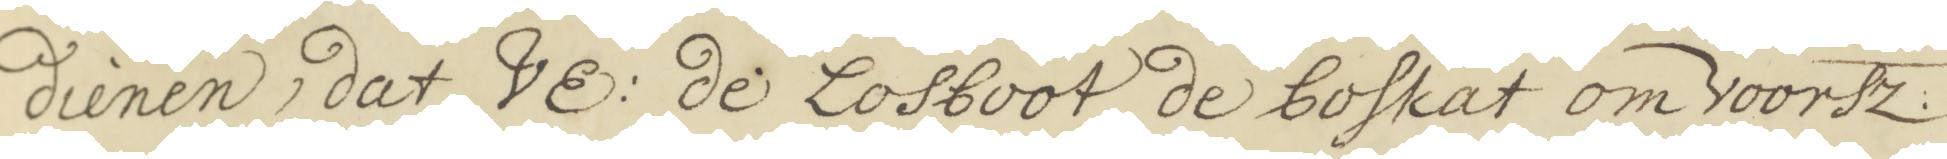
dienen, dat UE: de Losboot de boskat om voorsz:
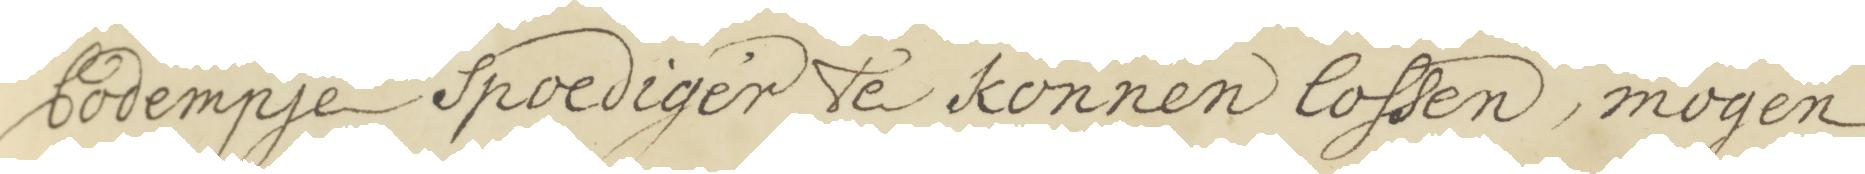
bodempje spoediger te konnen lossen, mogen
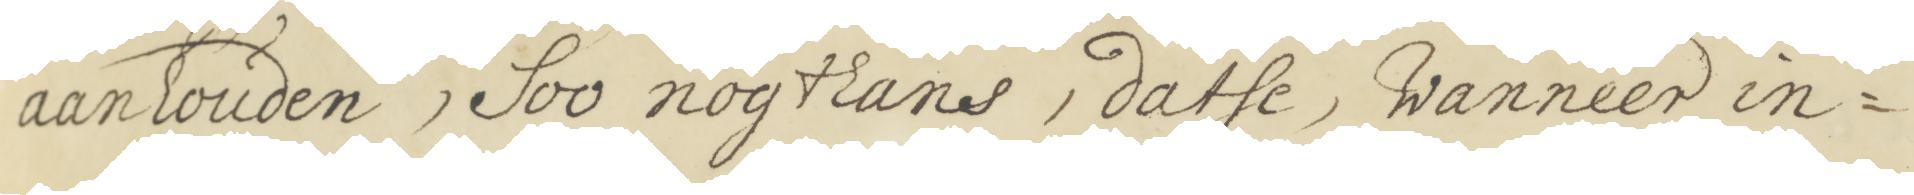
aanhouden, soo nogthans, datse, wanneer in=
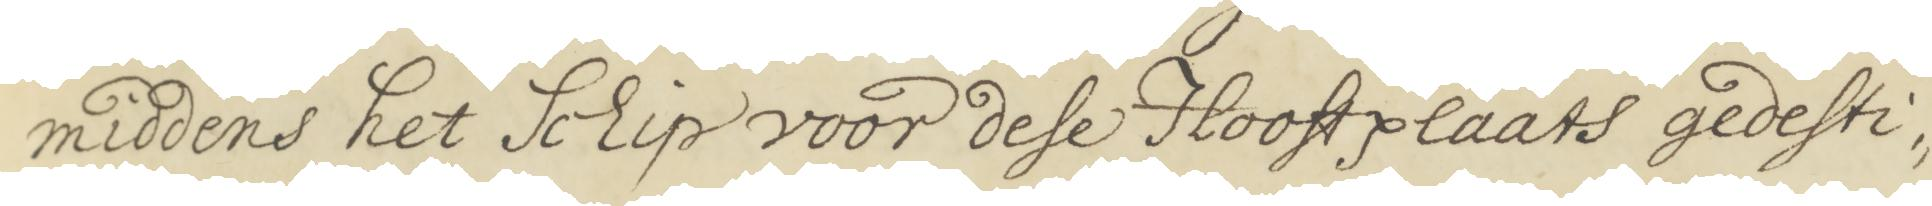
middens het schip voor dese Hooftplaats gedesti„
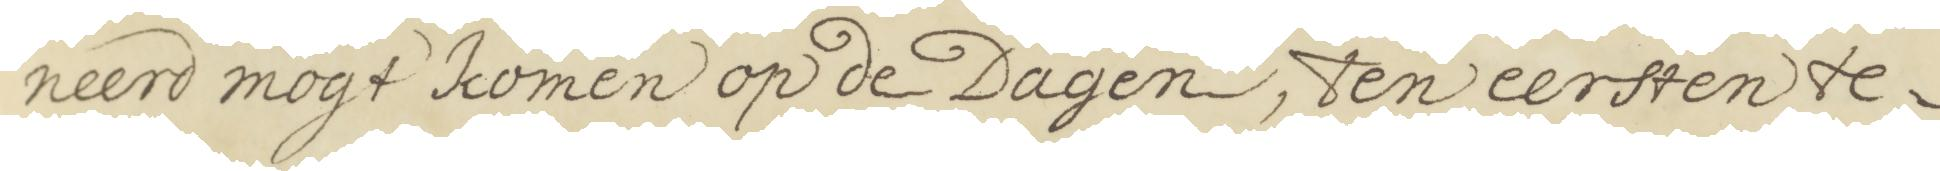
neerd mogt komen op de Dagen, ten eersten te=
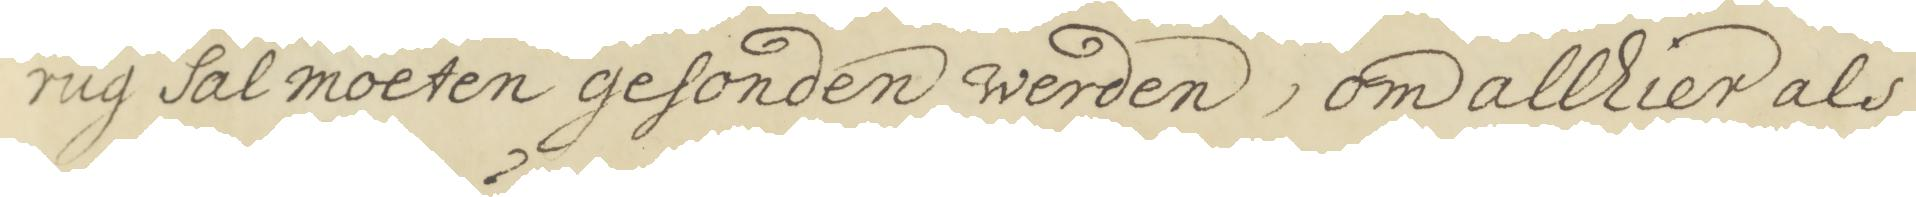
rug sal moeten gesonden werden, om allhier als
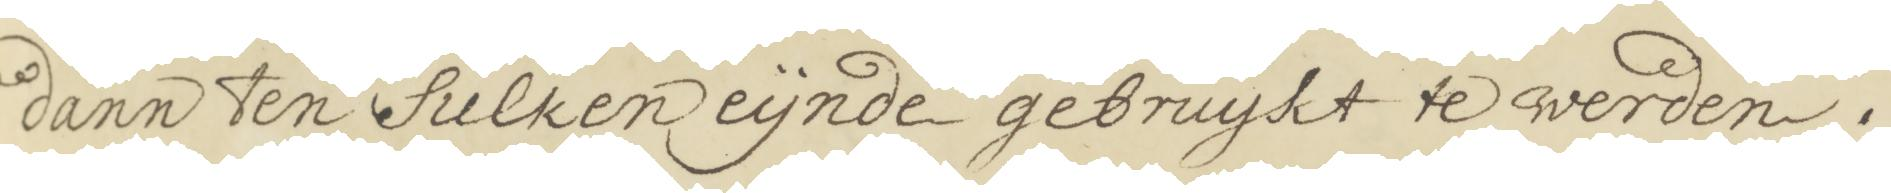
dann ten sulken eijnde gebruijkt te werden,
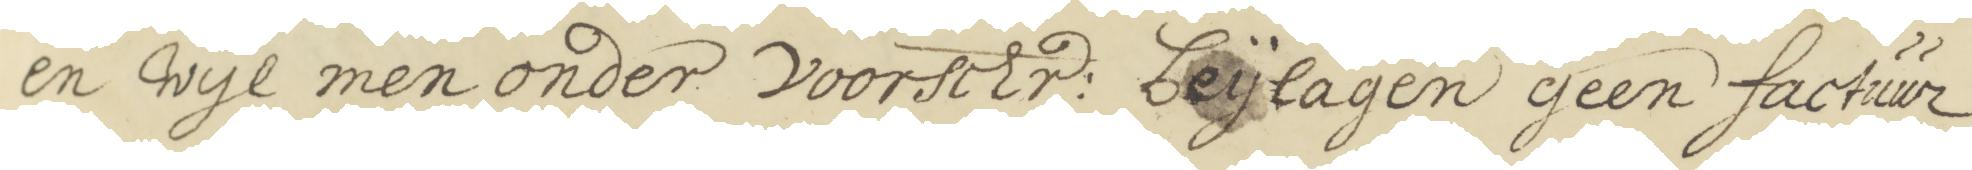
en wijl men onder voorschr: beijlagen geen factuur
